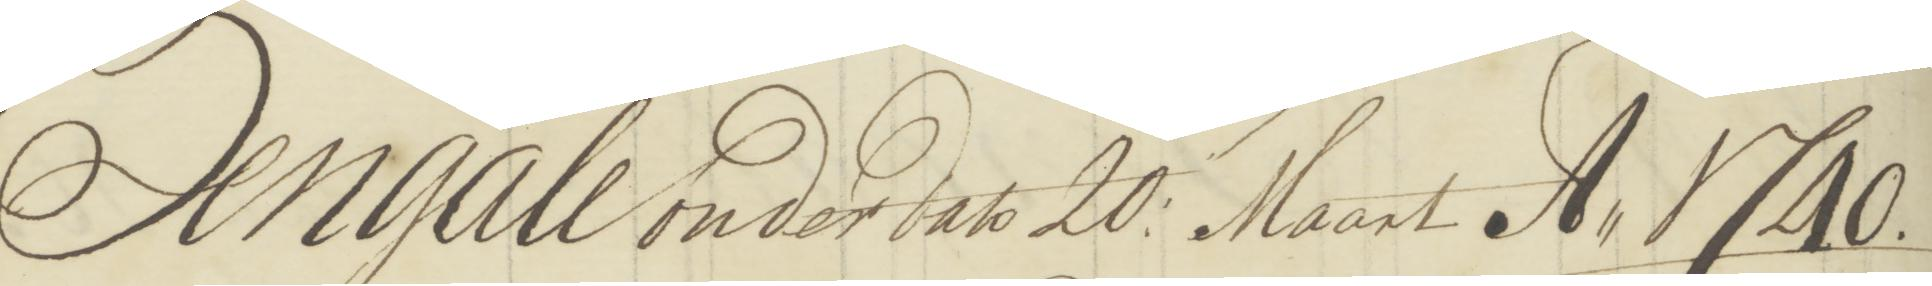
Van Bengale onder dato 20:' Maart A„o 1740.
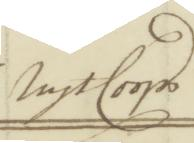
uytCoops
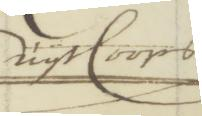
uijtCoops
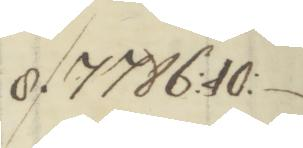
8ƒ7786:10:—
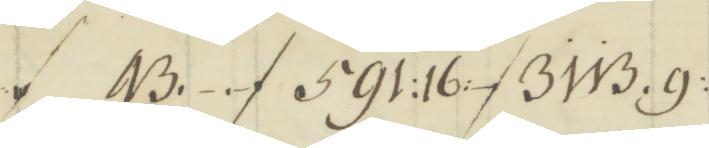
ƒ 43.-.-ƒ 591:16:ƒ3113.9
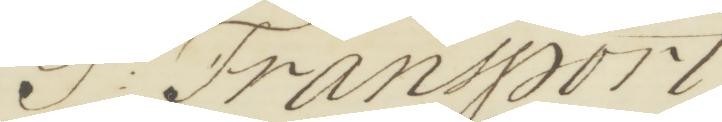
P:r Transport
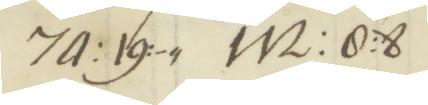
74:19:-„ 112:8:8
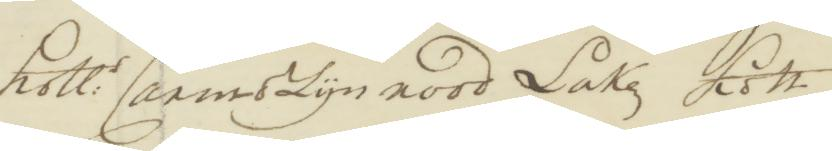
holl:s Carmozijn rood Laken kost
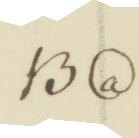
13@
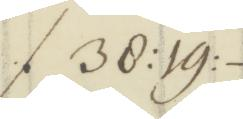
ƒ 38:19:
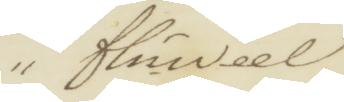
„ fluweel
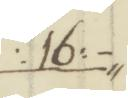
:16:-„
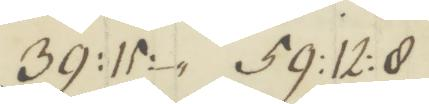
39:15:-„ 59:12:8
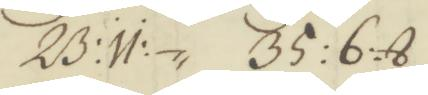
23:11:-„ 35:6:8
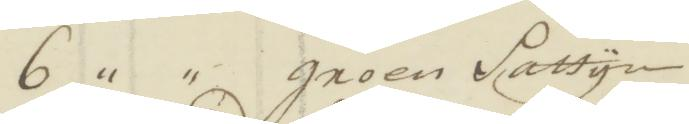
6 „ „ groen sattijn
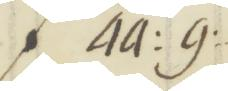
ƒ 44:9
